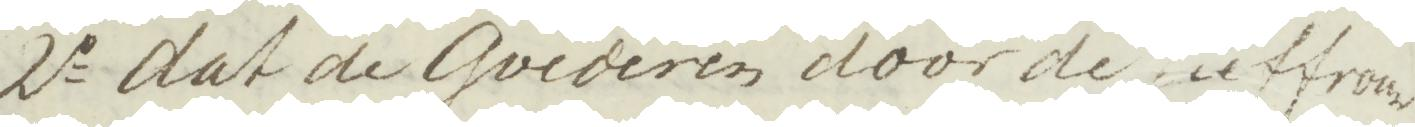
2=e dat de Goederen door de Juffrouw
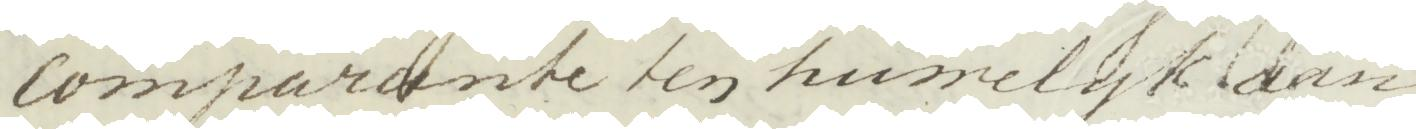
Comparante ten huwelyk aan
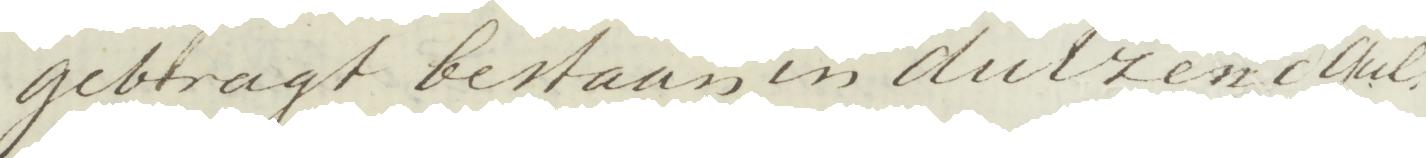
gebragt bestaan in duizend Gul,
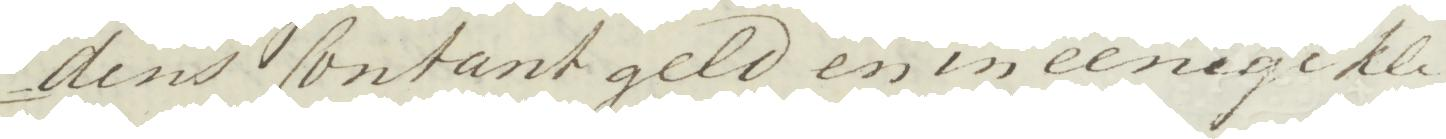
=dens Contant geld en in eenige kle
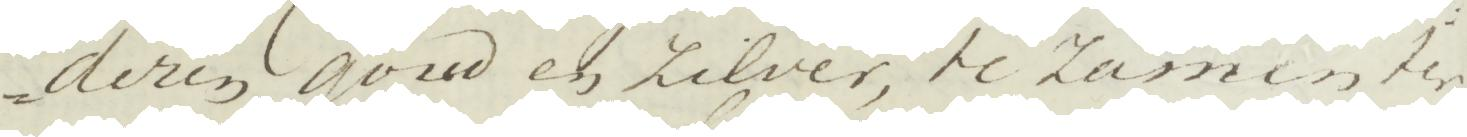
=deren goud en zilver, te zamen ter
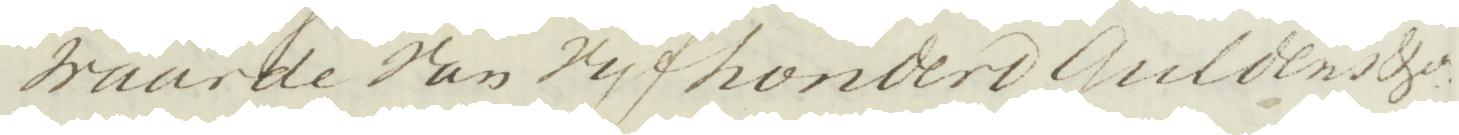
waarde van vijfhonderd Guldens &o
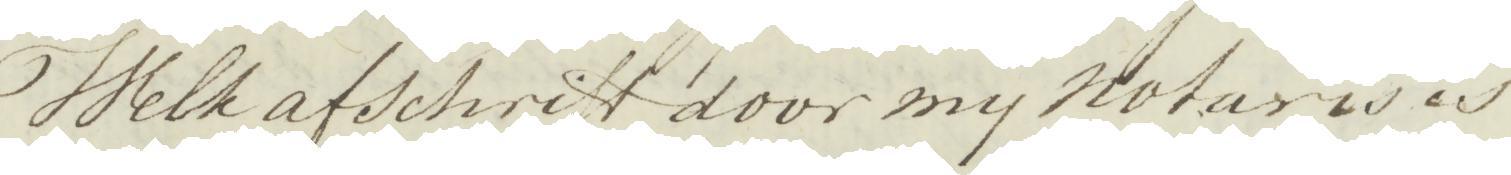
Welk afschrift door mij Notaris is is
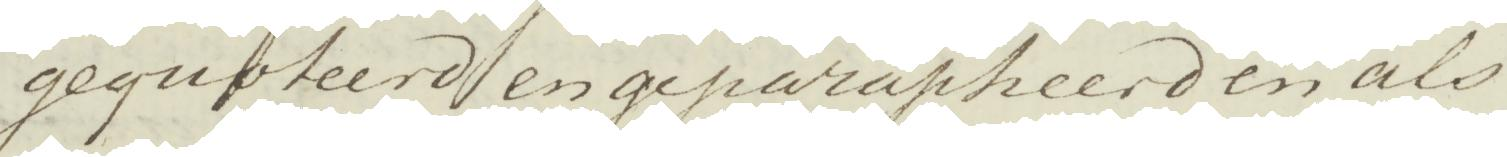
gequoteerd en geparapheerd en als
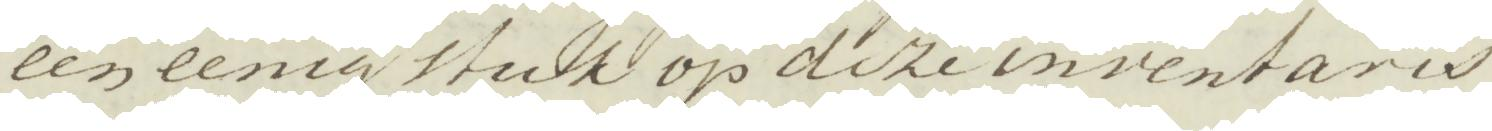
een eenig stuk op deze inventaris
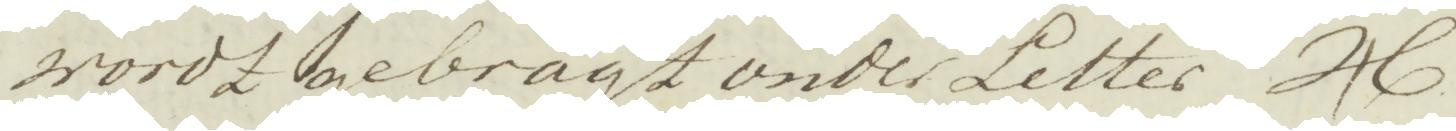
wordt gebragt onder Letter H
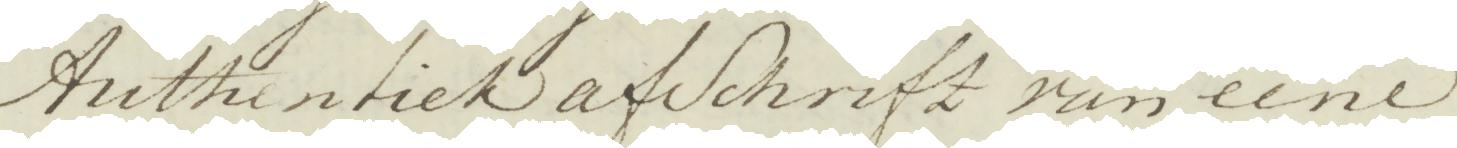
Authentiek afschrift van eene
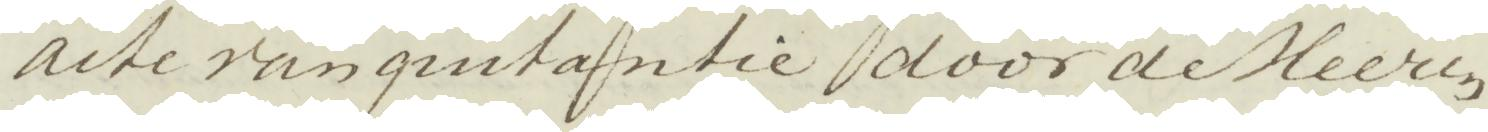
acte van quitantie door de Heeren
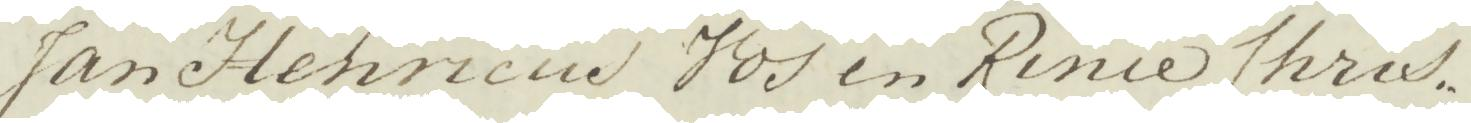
Jan Henricus Vos en Rinie Chris„
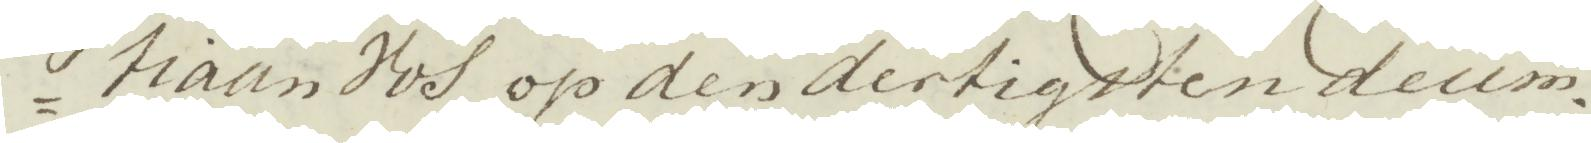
= tiaan Vos op den dertigsten decem„
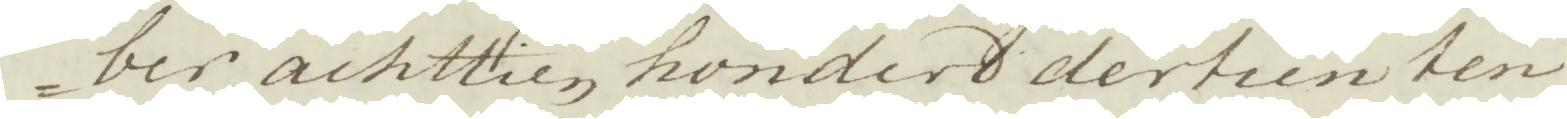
= ber achttien honderd dertien ten
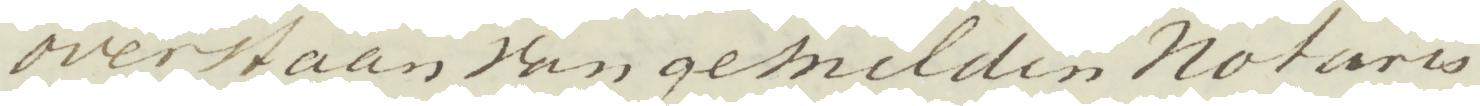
overstaan van gemelden Notaris
